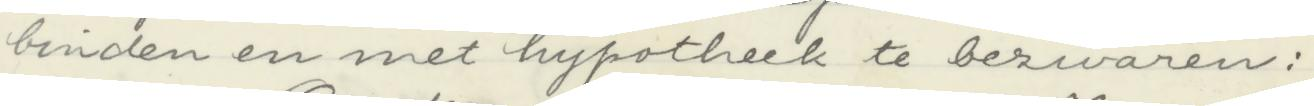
binden en met hypotheek te bezwaren:
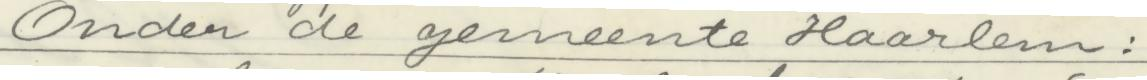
Onder de gemeente Haarlem:
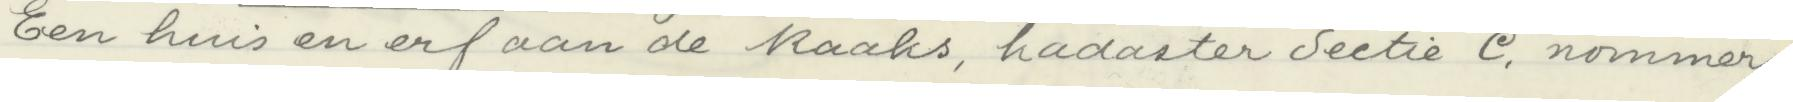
Een huis en erf aan de Raaks, kadaster Sectie C, nommer
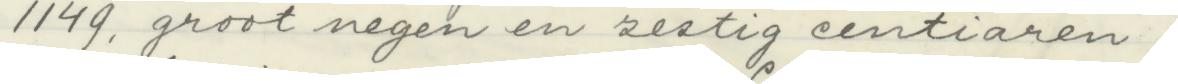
1149, groot negen en zestig centiaren
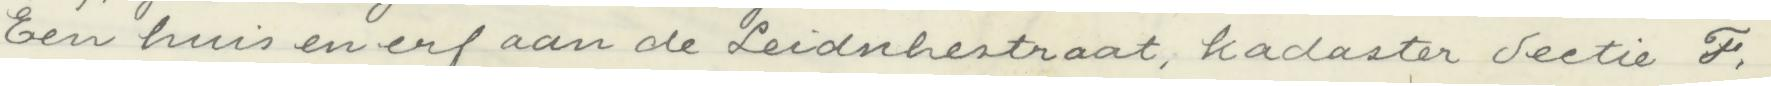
Een huis en erf aan de Leidschestraat, kadaster Sectie F.
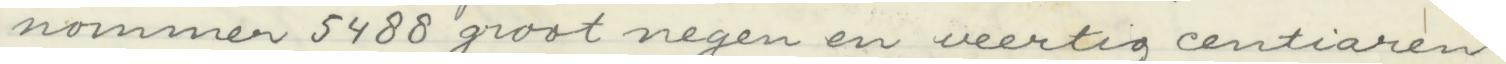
nommer 5488 groot negen en veertig centiaren
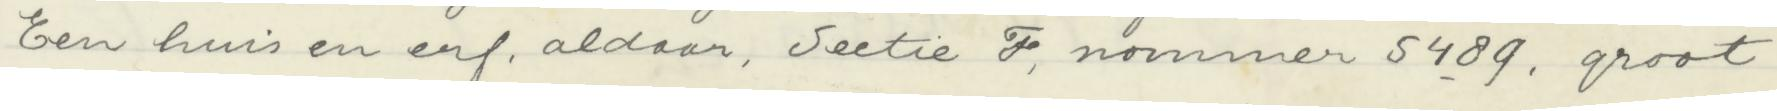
Een huis en erf, aldaar, Sectie F, nommer 5489. groot
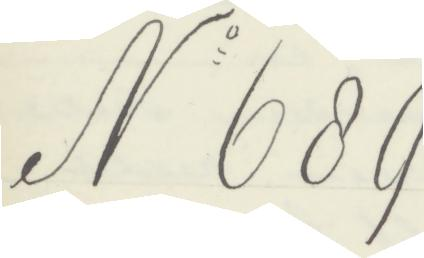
N=o 689
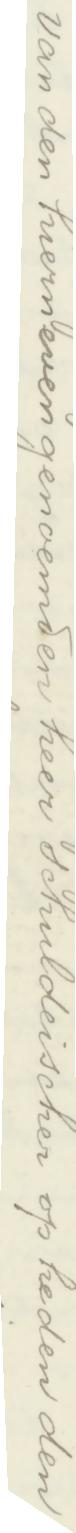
van den hierneven genoemden heer schuldeischer op heden den
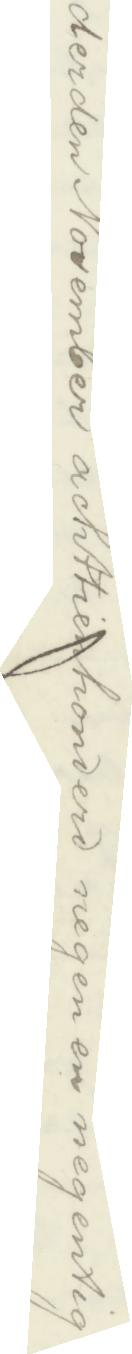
derden November achttienhonderd negen en negentig
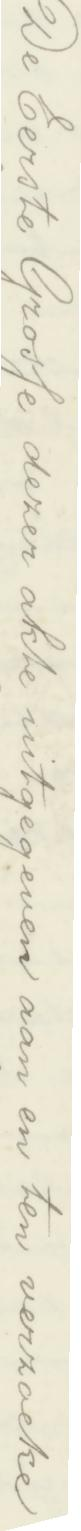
De Eerste Grosse dezer akte uitgegeven aan en ten verzoeke
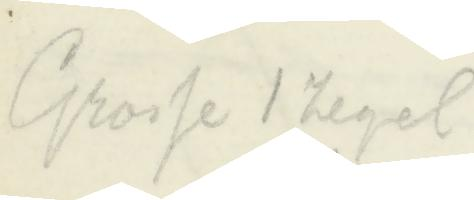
Grosse 1 zegel
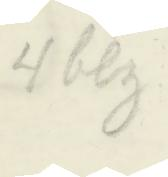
4 blz
